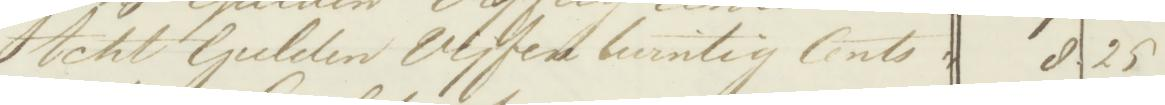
Acht Gulden Vijfen twintig Cents „ 8.25
